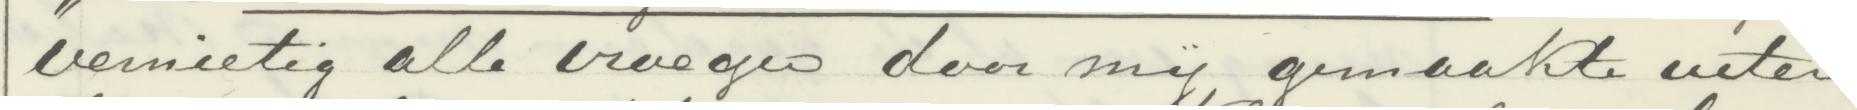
vernietig alle vroeger door mij gemaakte uiter
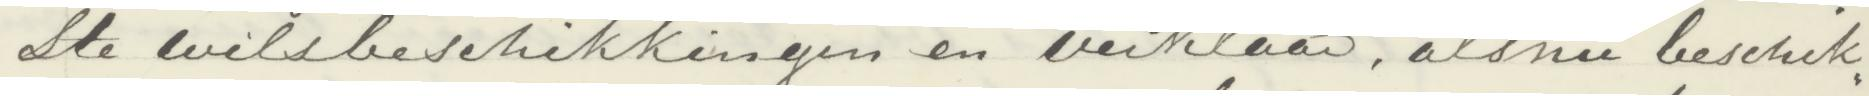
ste wilsbeschikkingen en verklaar, alsnu beschik„
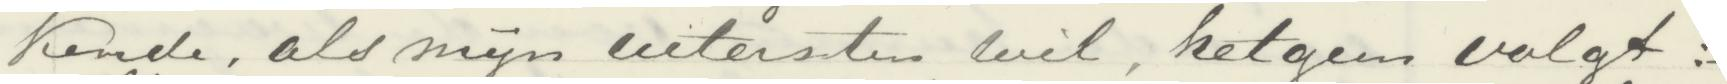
kende, als mijn uitersten wil, hetgeen volgt:
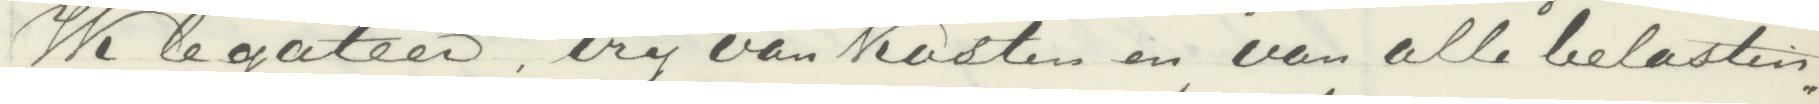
Ik legateer, vrij van kosten en van alle belastin„
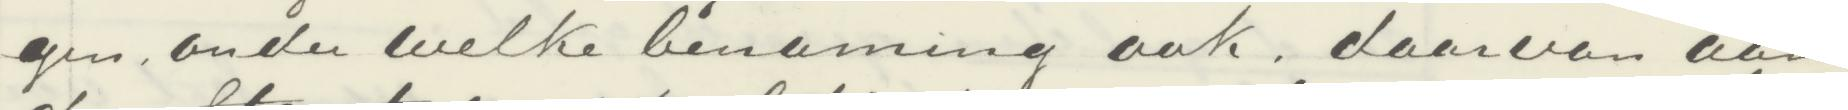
gen, onder welke benaming ook, daarvan aan
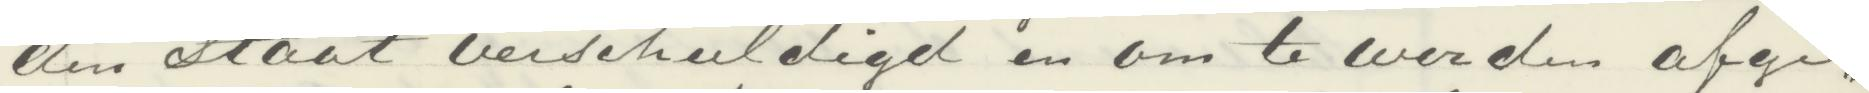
den Staat verschuldigd en om te worden afge„
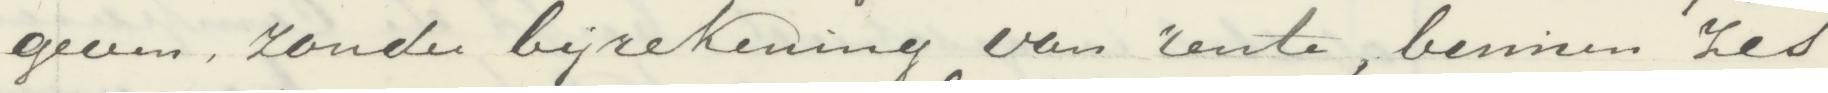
geven, zonder bijrekening van rente, binnen zes
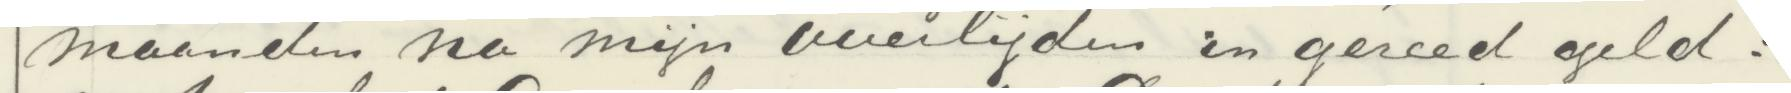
maanden na mijn overlijden in gereed geld:
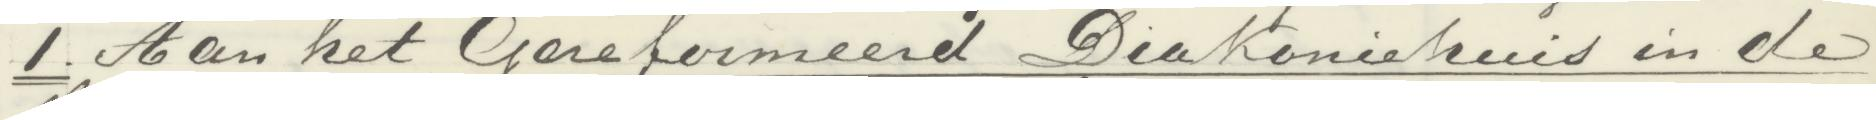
1. Aan het Gereformeerd Diakoniehuis in de
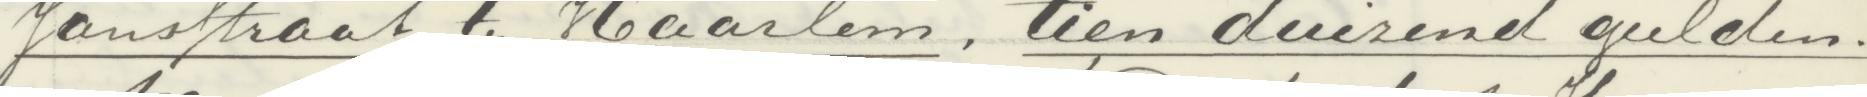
Jansstraat te Haarlem, tien duizend gulden.
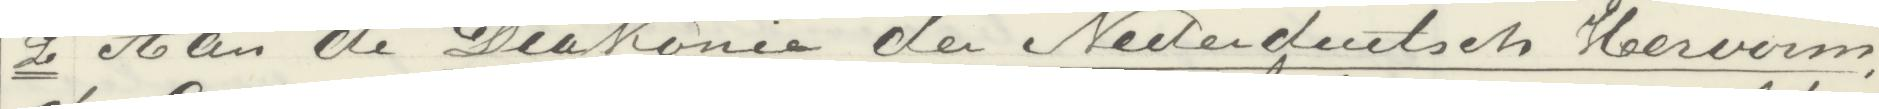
2 Aan de Diakonie de Nederduitsch Hervorm,
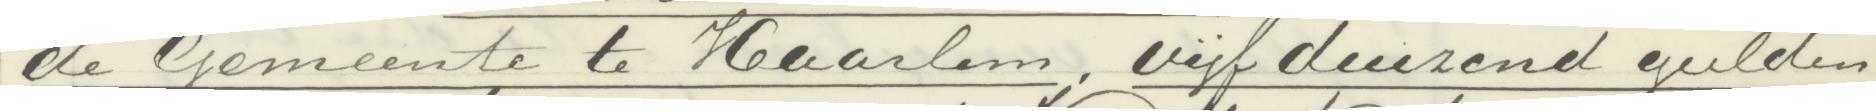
de Gemeente te Haarlem, vijf duizend gulden
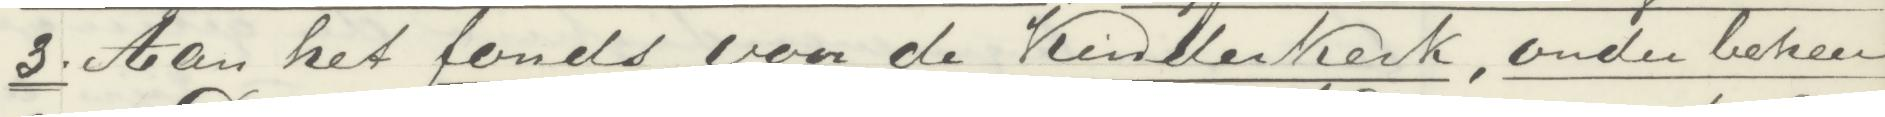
3. Aan het fonds voor de Kinderkerk, onder beheer
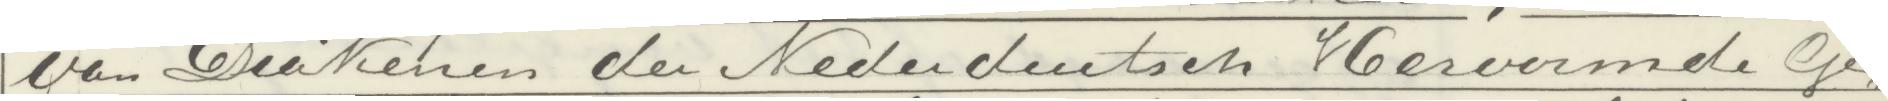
van Diakenen der Nederduitsch Hervormde Ge
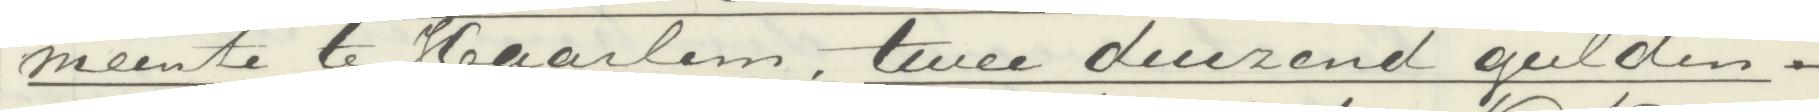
meente te Haarlem, twee duizend gulden.
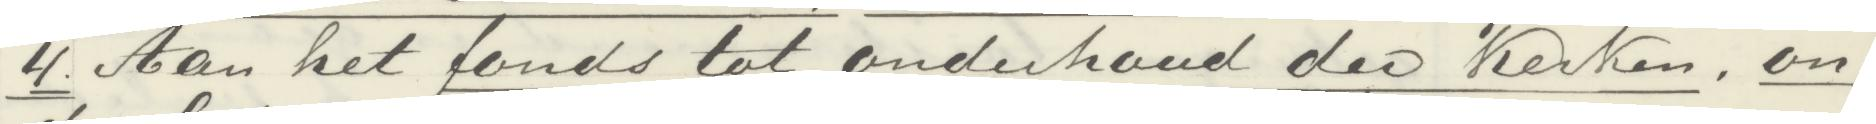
4. Aan het fonds tot onderhoud der kerken, on
